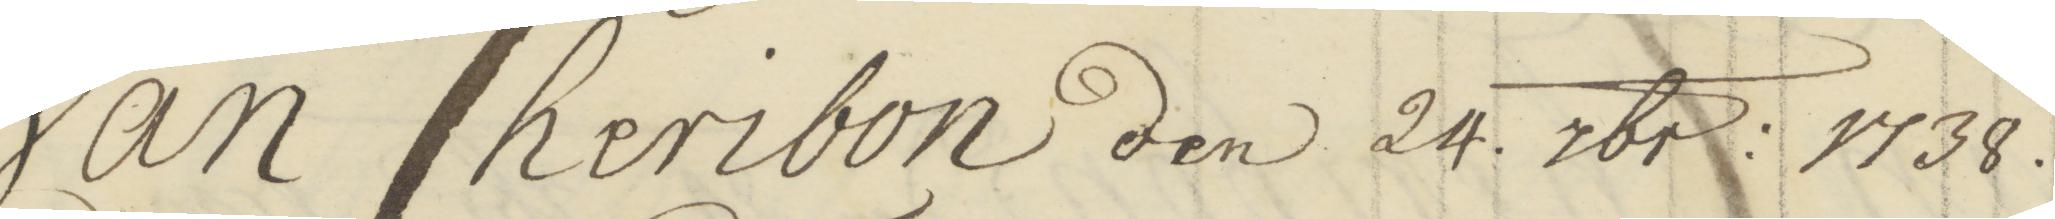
Van Cheribon den 24. 7br: 1738
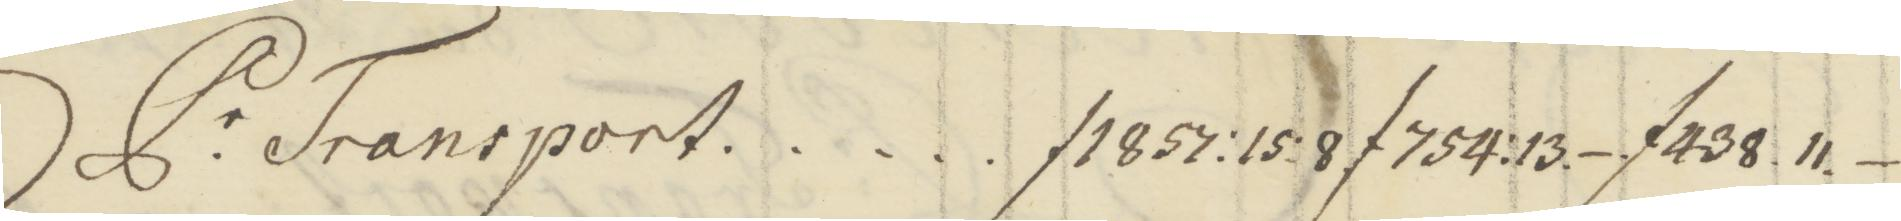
P:r Transport - - - - - ƒ 1857: 15: 8 ƒ 754: 13. — . ƒ 438. 11. —
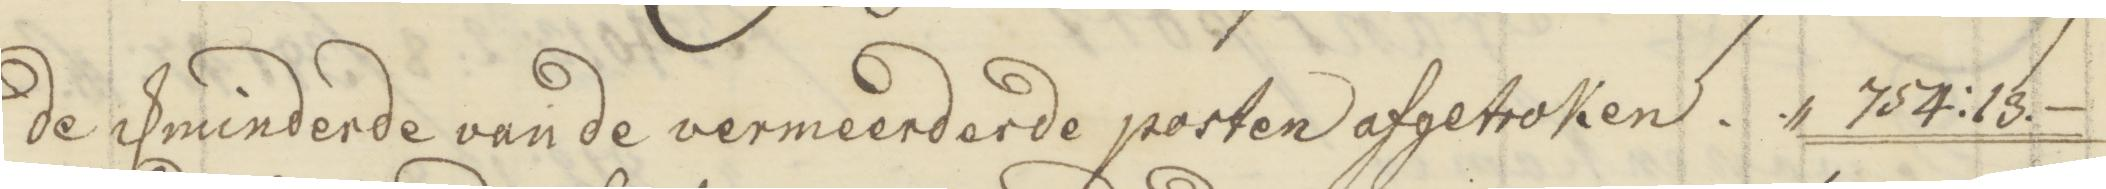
de verminderde van de vermeerderde posten afgetroken - - „ 754: 13. —
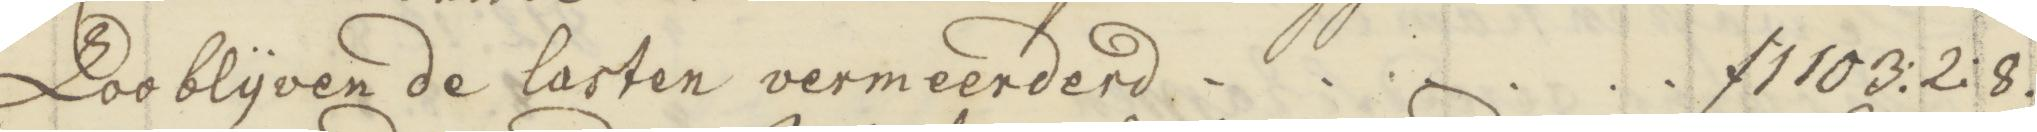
zoo blijven de lasten vermeerderd - - - - - - - ƒ 1103: 2: 8
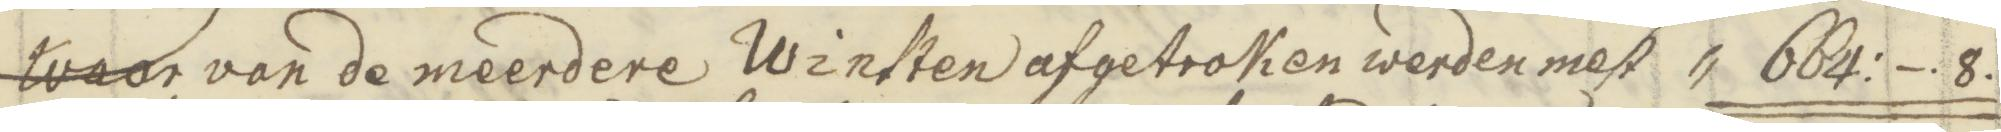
waar van de meerdere winsten afgetroken werden met „ 664: —. 8
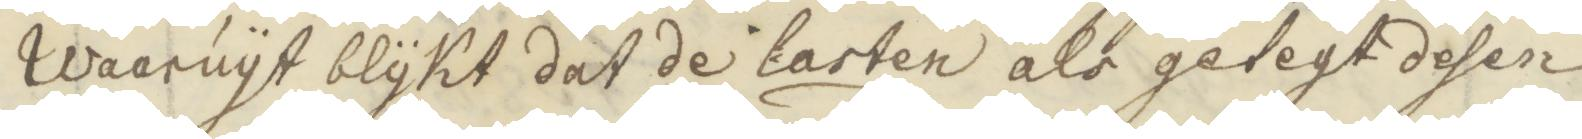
waaruijt blijkt dat de lasten als gesegt desen
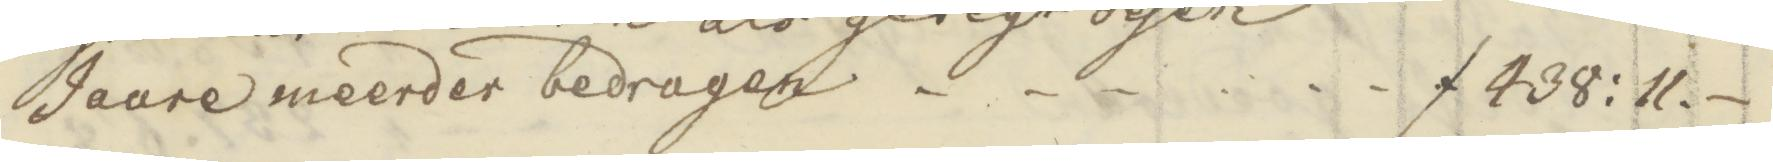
Jaare meerder bedragen - - - - - - ƒ 438: 11. —
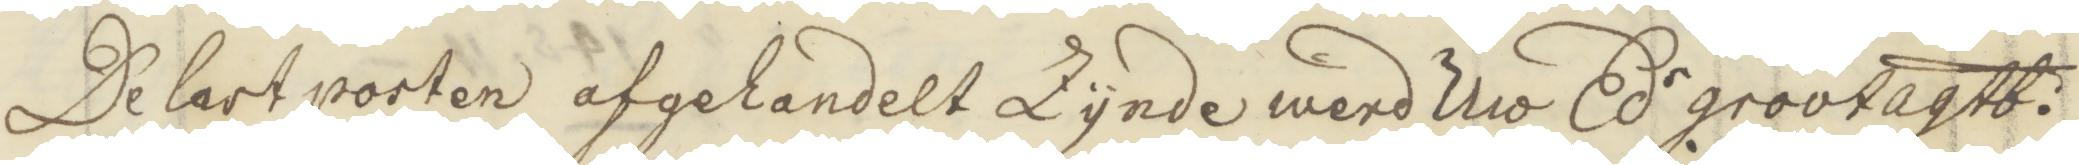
De last posten afgehandelt zijnde werd Uw Eds groot agtb:
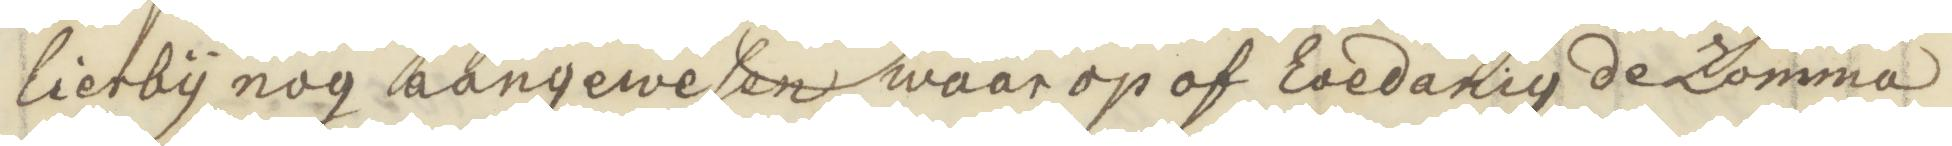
hierbij nog aangewesen waar op of hoedanig de zomma
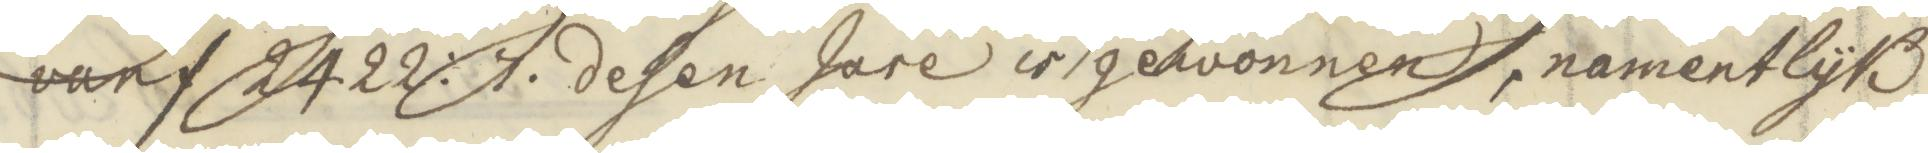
van ƒ 2422: 7. desen Jare is gewonnen, namentlijk
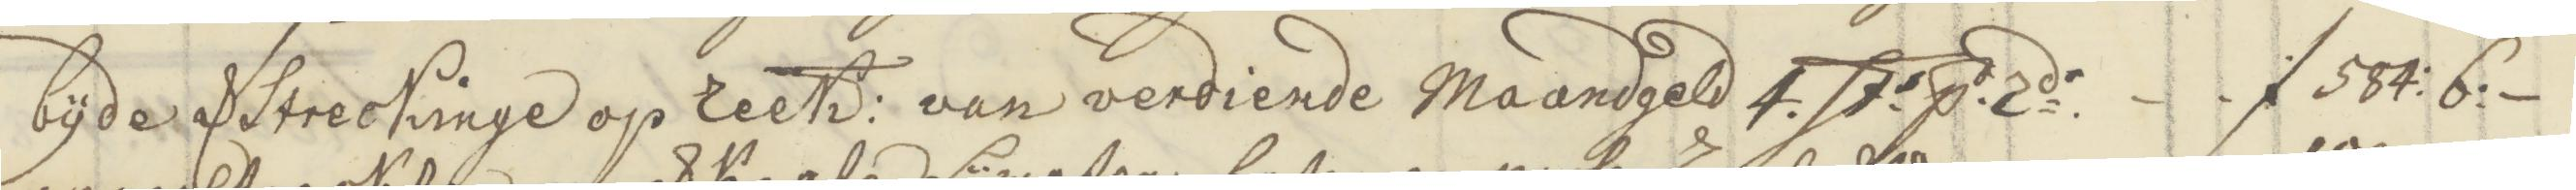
bij de verstreckinge op reek: van verdiende maandgeld 4. st:s p:r R=ds . - - ƒ 584: 6: —
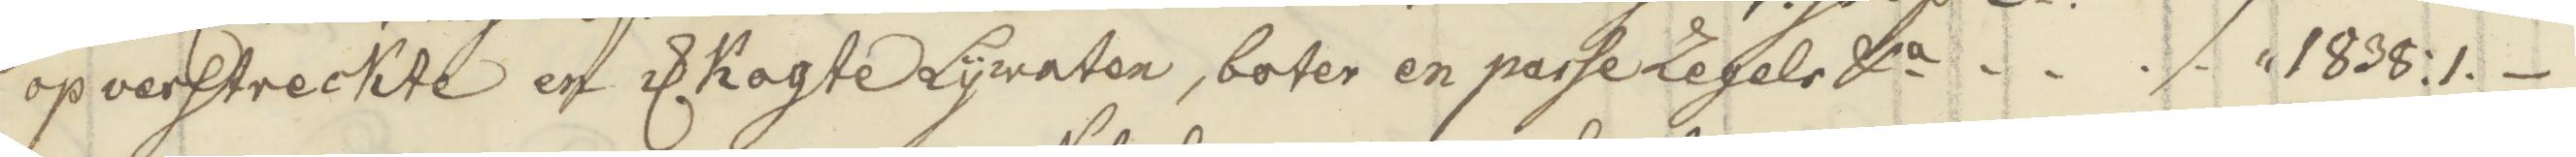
op verstreckte en verkogte Lijwaten, boter en passe zegels &-a - - . - „ 1838: 1. —
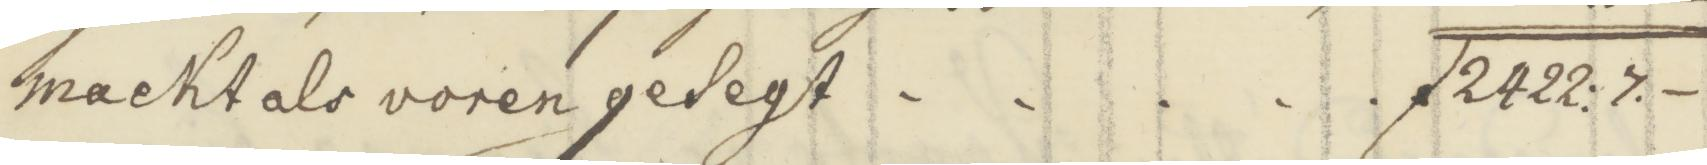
maekt als voren gesegt - - - - - ƒ 2422: 7.
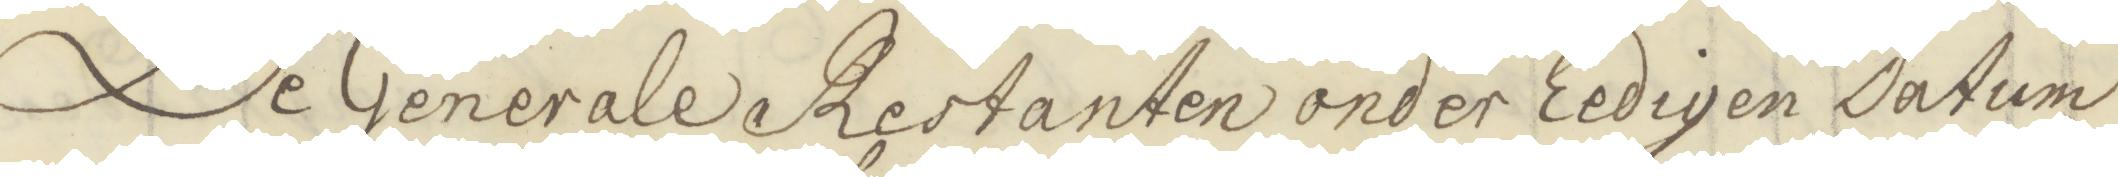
De Generale Restanten onder Hedigen Datum
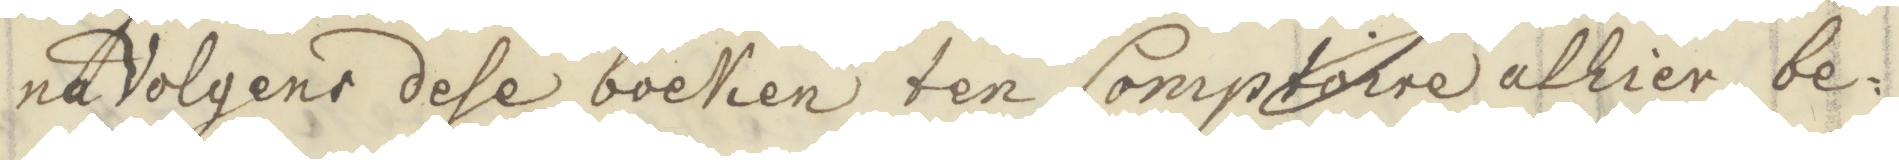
na Volgens dese boeken ten Comptoire alhier be„
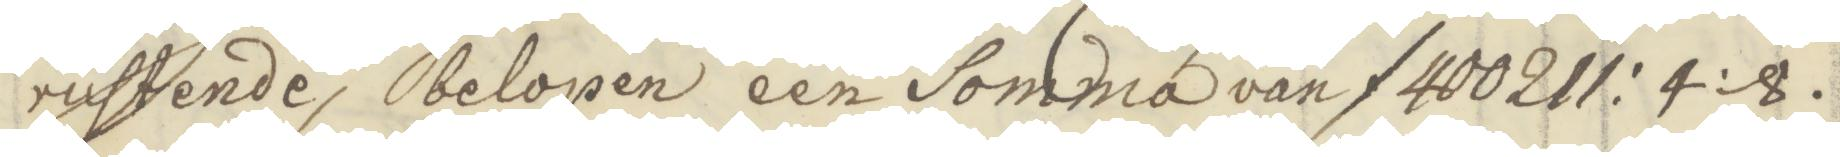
rustende, belopen een somma van ƒ 400211: 4: 8.
